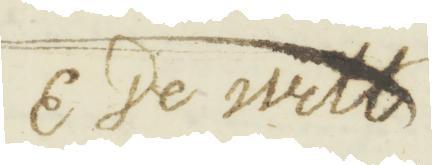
E de witt
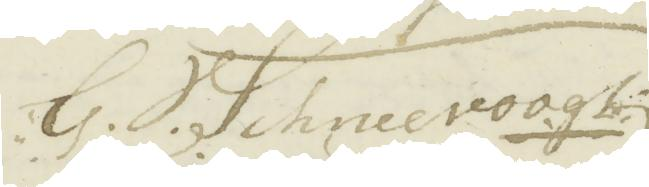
G. J. Schneevoogt
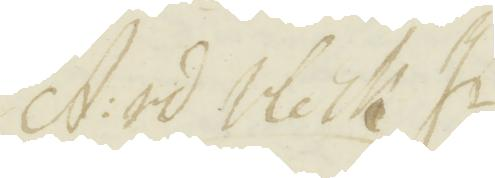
A: vd Vlerk Jr
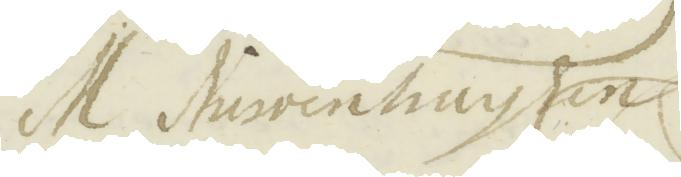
M Niwenhuysen
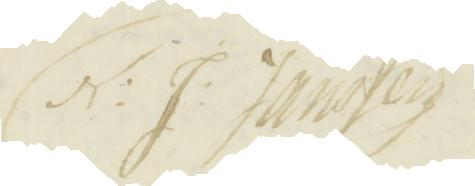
N:J: Janssen
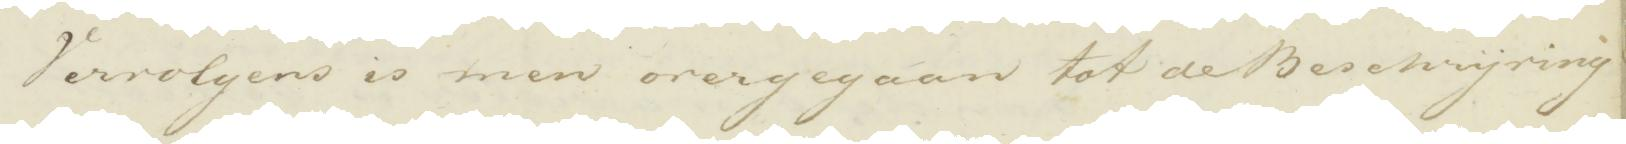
Vervolgens is men overgegaan tot de Beschrijving
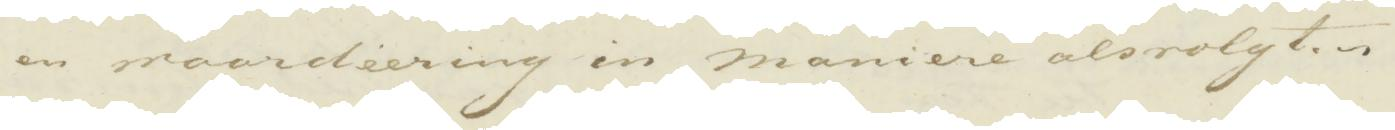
en waardeering in maniere als volgt.
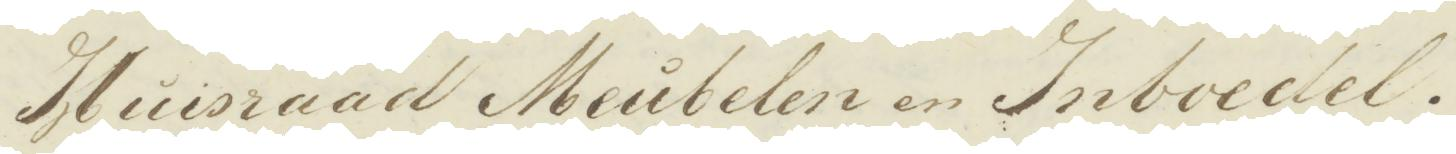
Huisraad Meubelen en Inboedel.
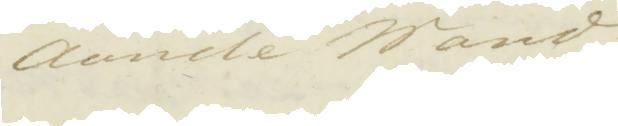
Aande Wand
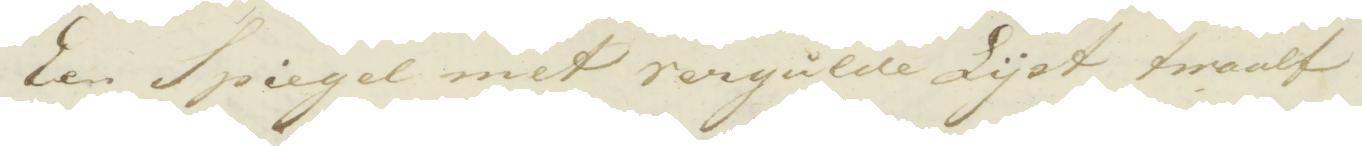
Een spiegel met vergulde Lijst twaalf
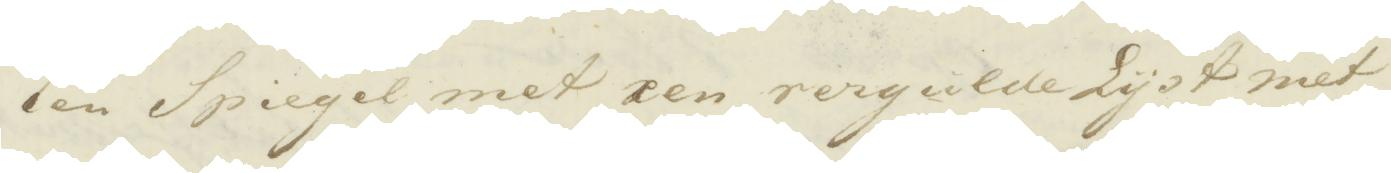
een spiegel met een vergulde Lijst met
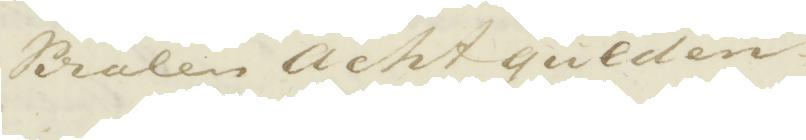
Kralen acht gulden
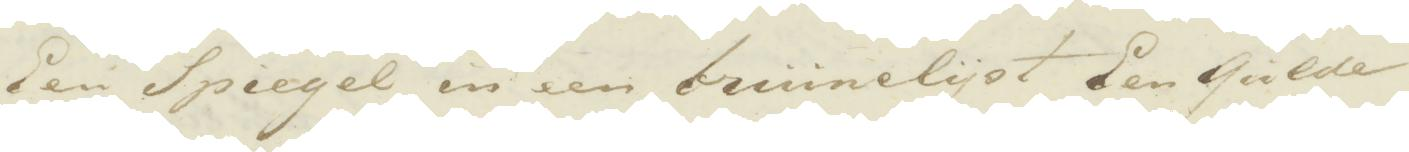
Een spiegel in een bruine lijst Een gulde
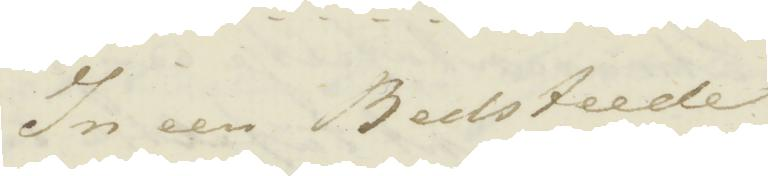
In een Bedsteede
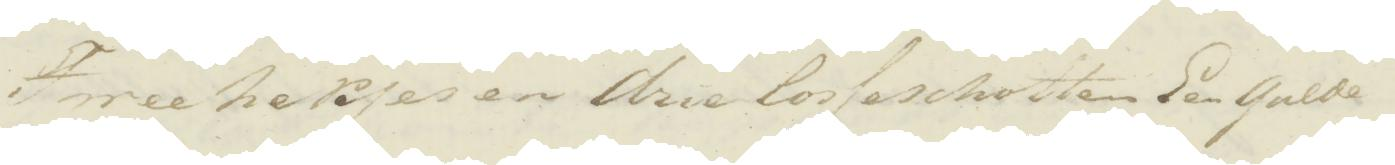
Twee hekjes en drie losse schotten Een Gulde
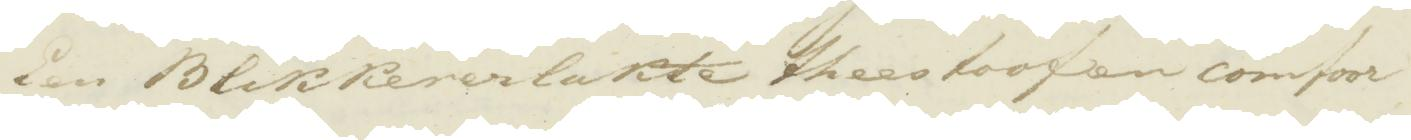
Een Blikke verlakte theestoofen comfoor
